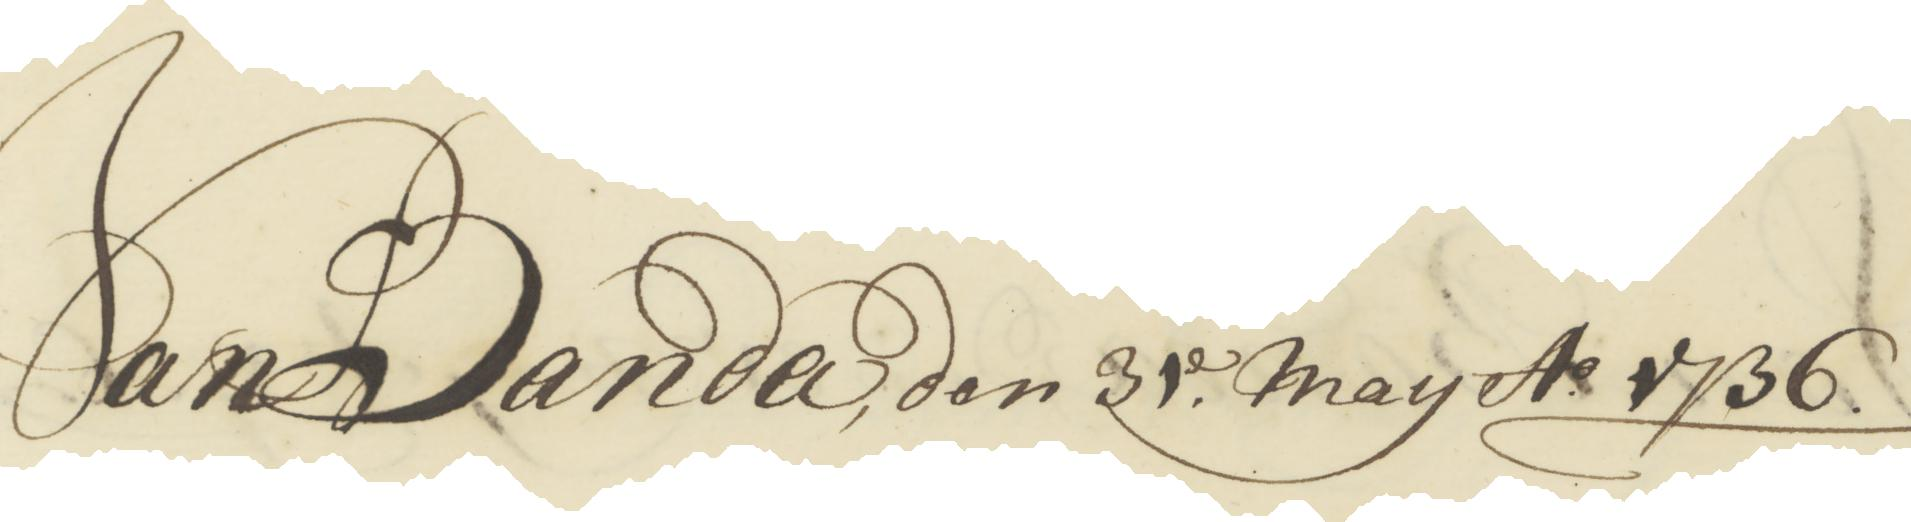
Van Banda, den 31:e may A:o 1736.
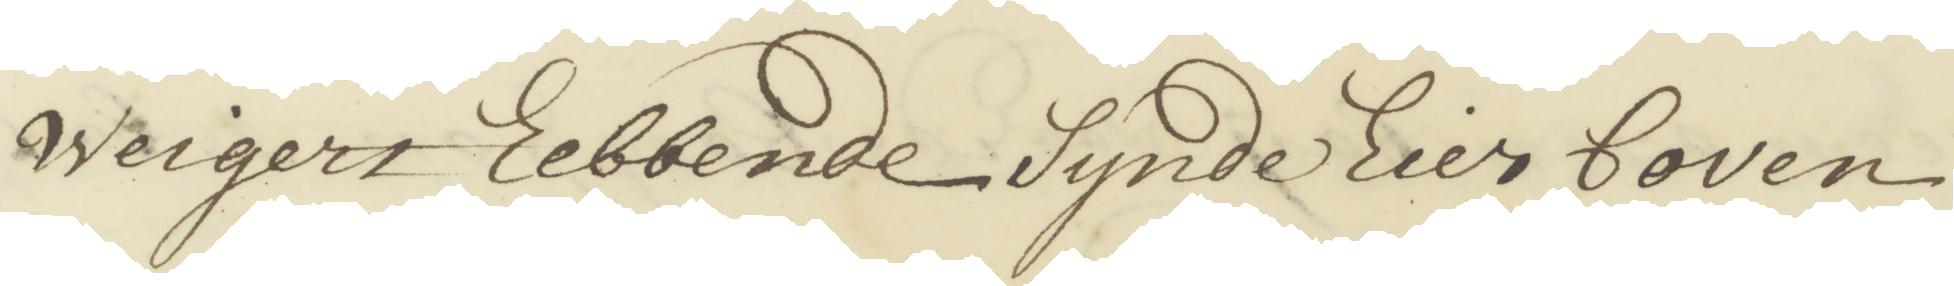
weigert hebbende Synde hier boven
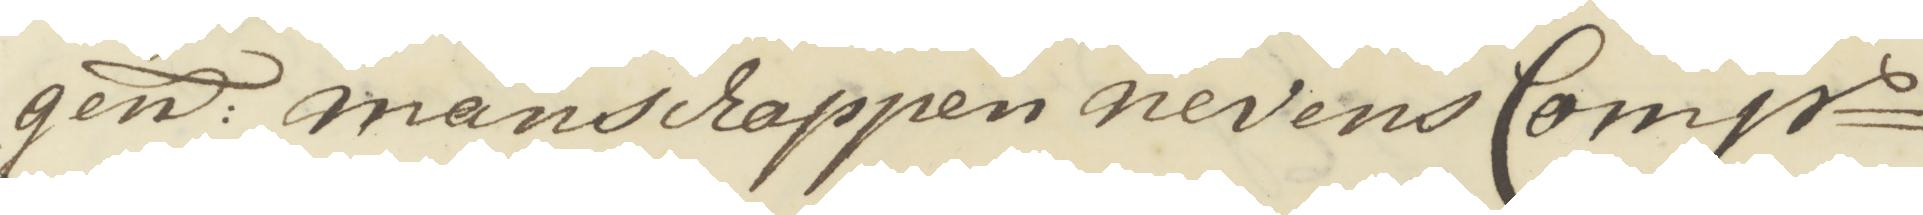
gen: manschappen nevens Comp=s
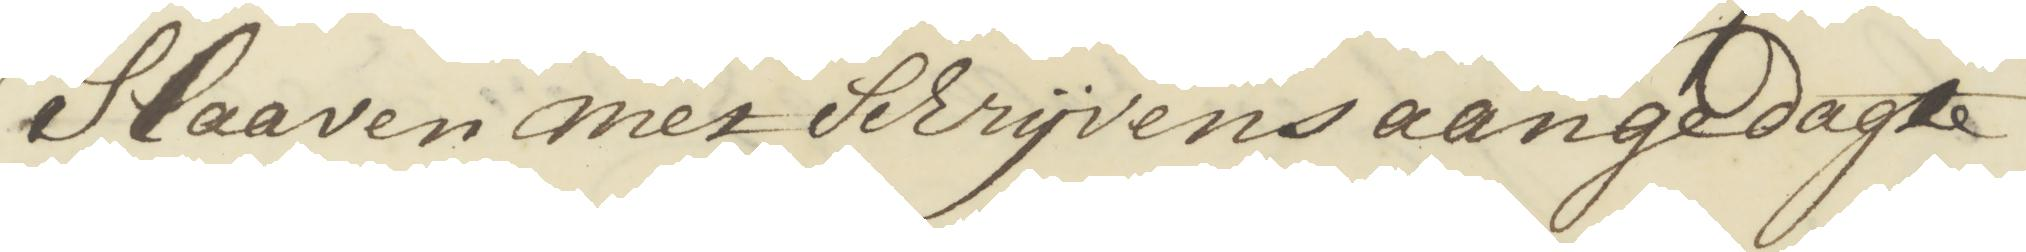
Slaaven met schrijvens aangedagte
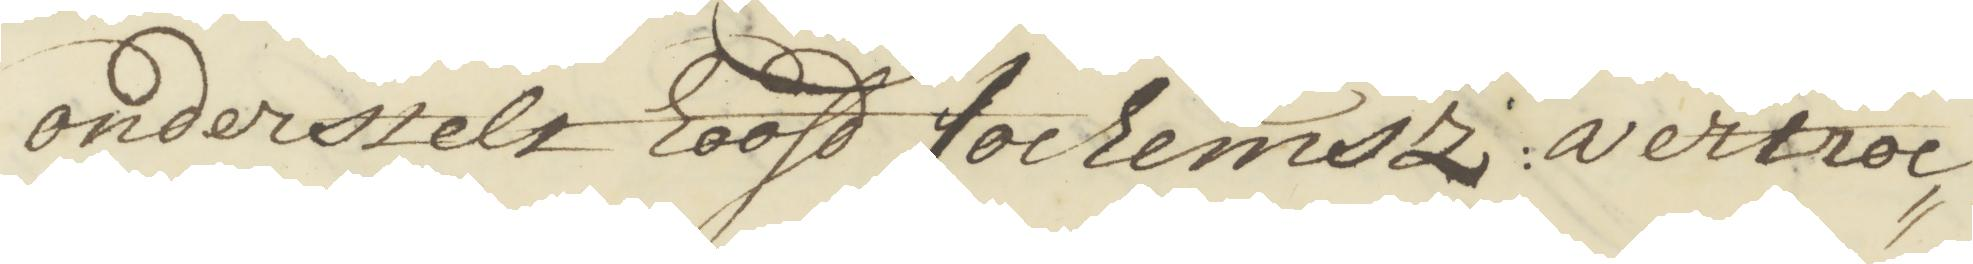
onderstelt hoofd Jochemsz: vertroc„
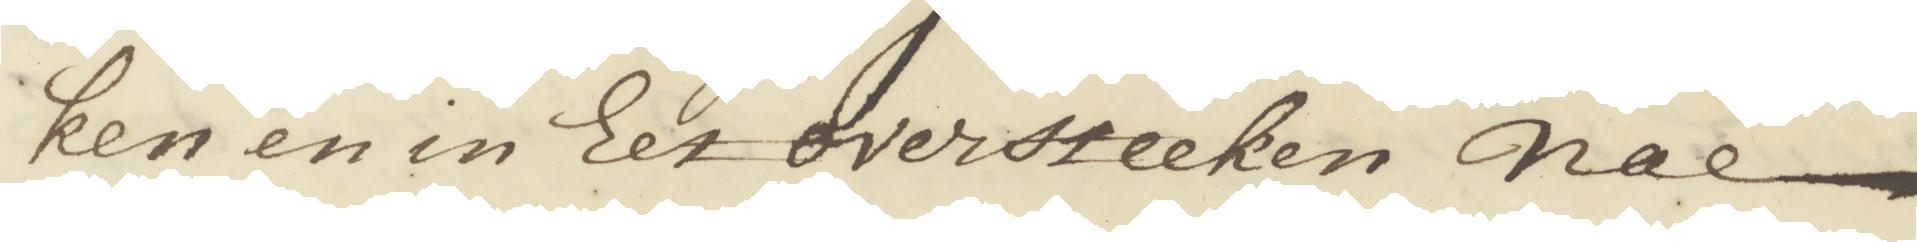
ken en in het oversteeken nae
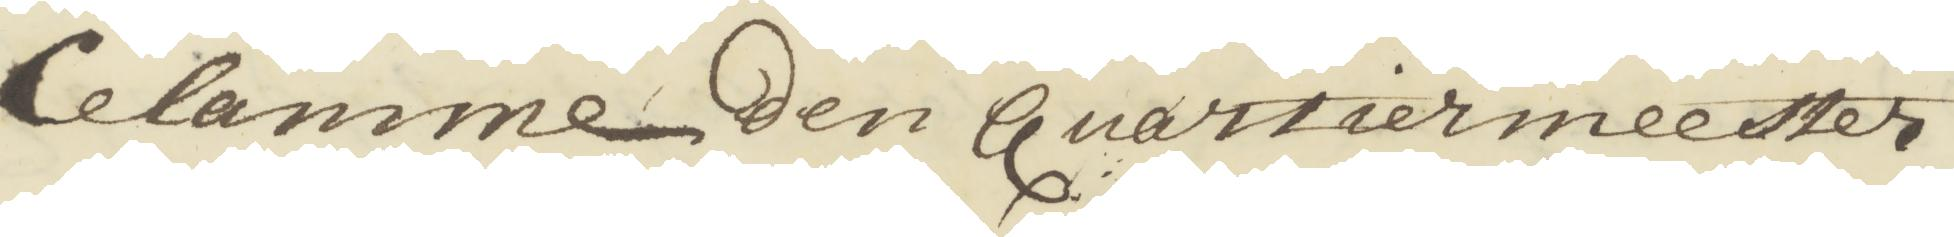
Celamme den Quartiermeester
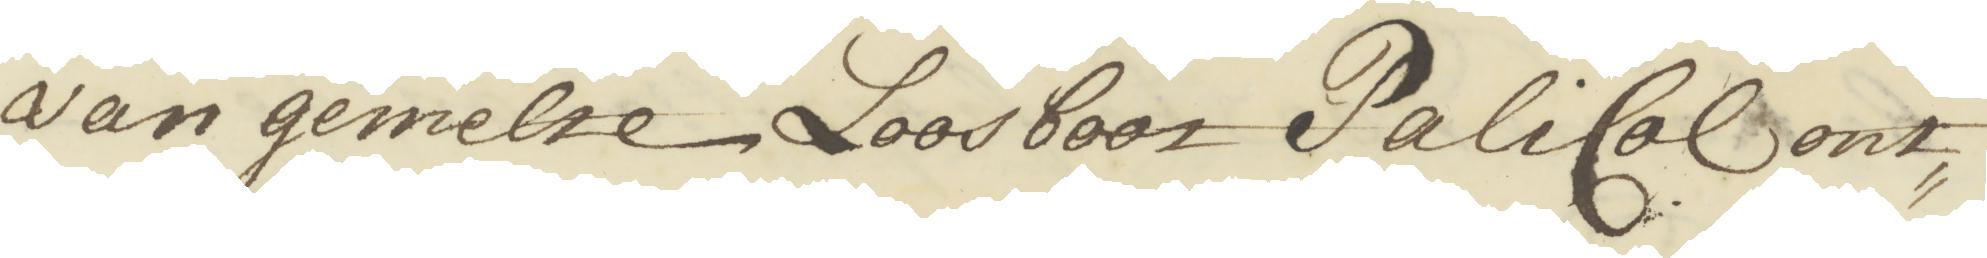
van gemelte Loosboot Palicol ont„
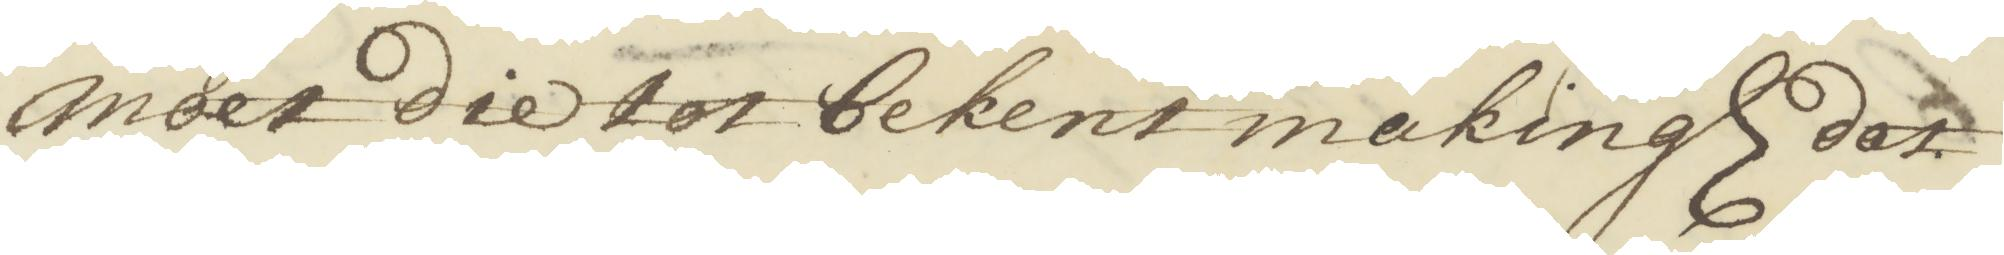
moet die tot bekent makingh dat
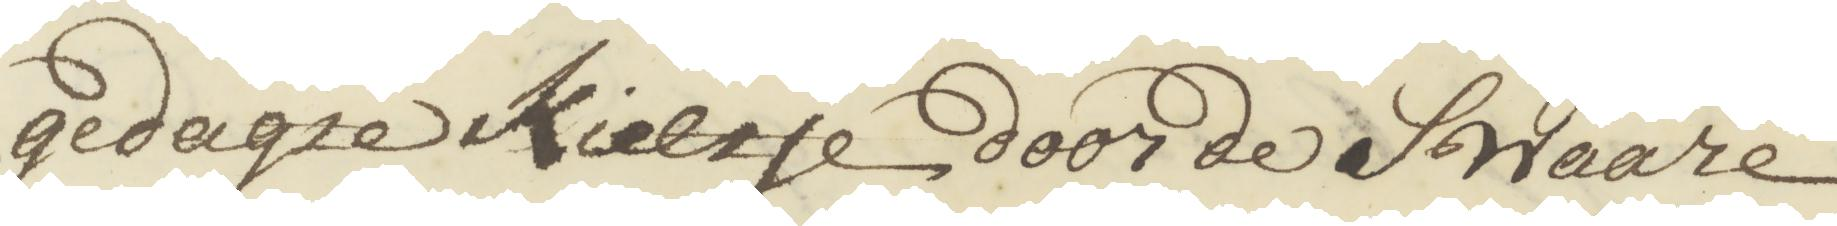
gedagte kieltje door de Swaare
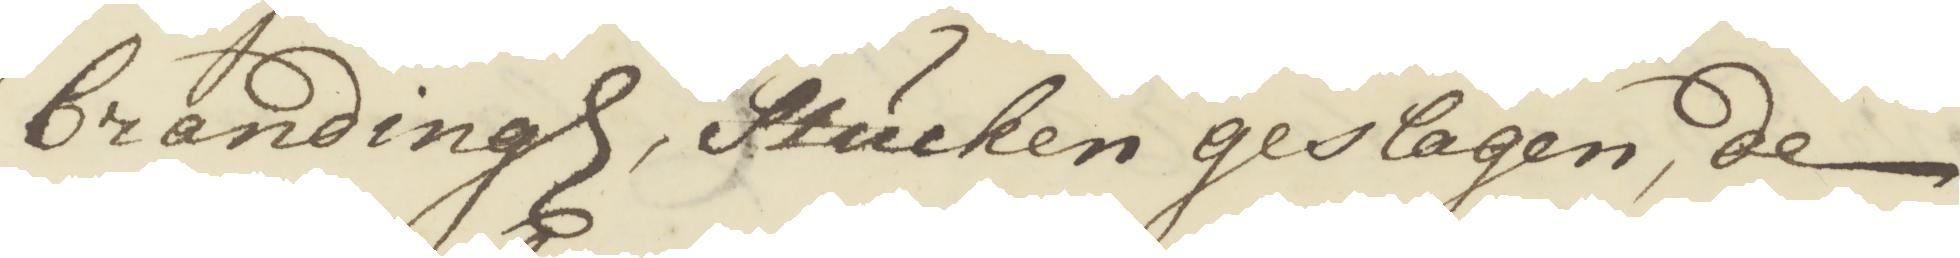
brandingh, Stucken geslagen, de
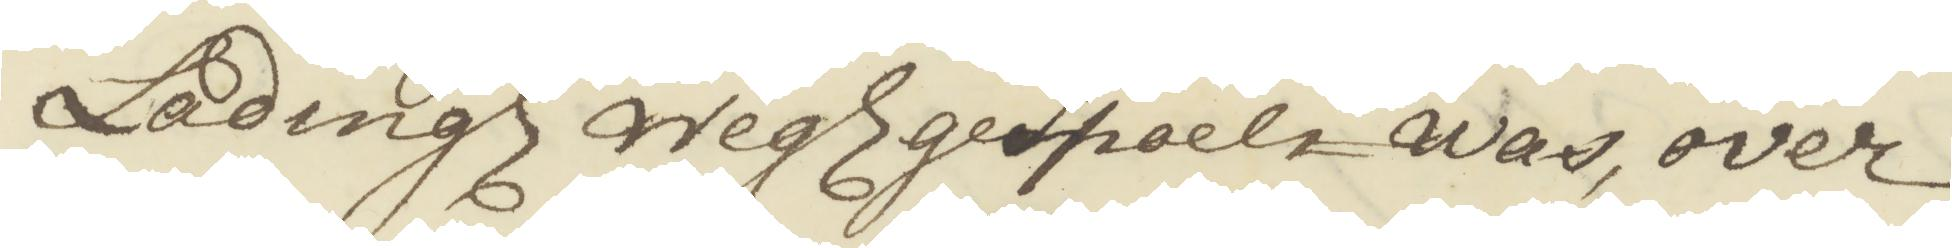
Ladingen weghgespoelt was, over
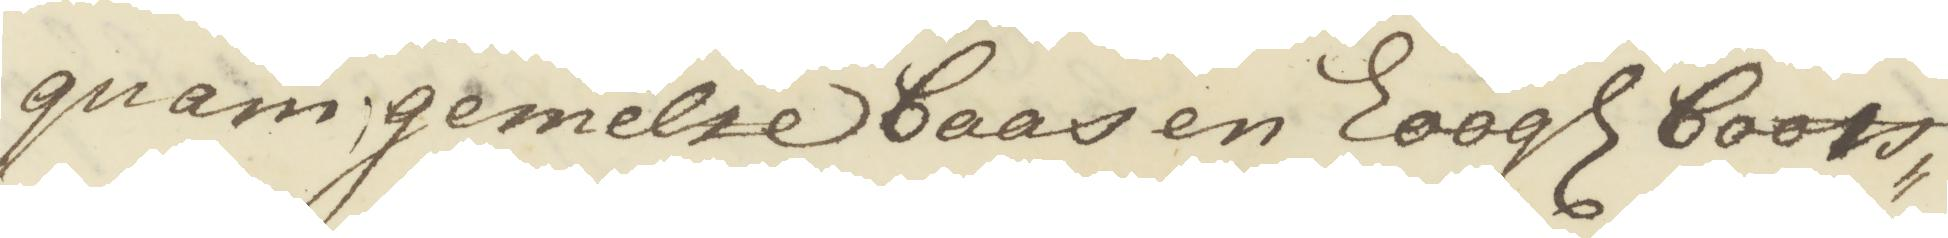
quam; gemelte baas en hoogh boots„
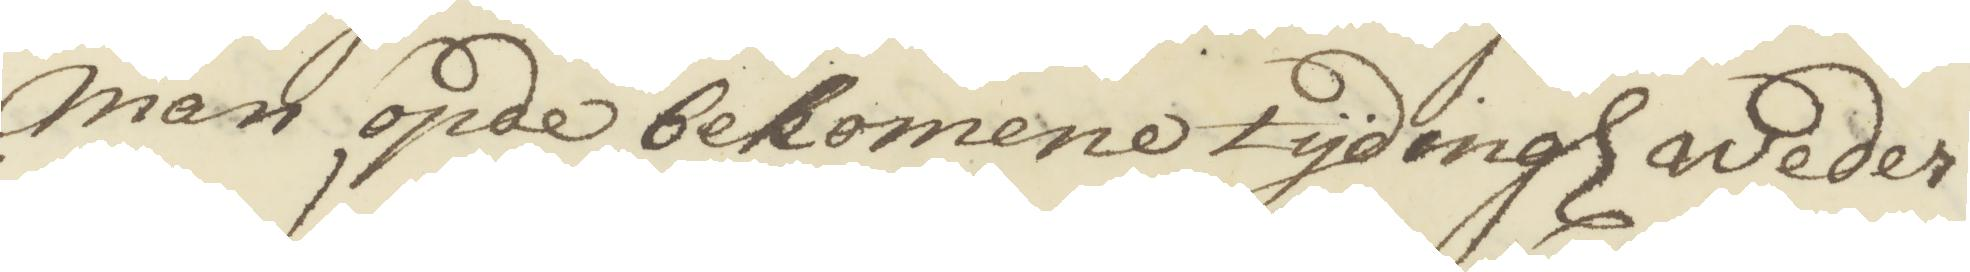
man, opde bekomene tijdingh weder
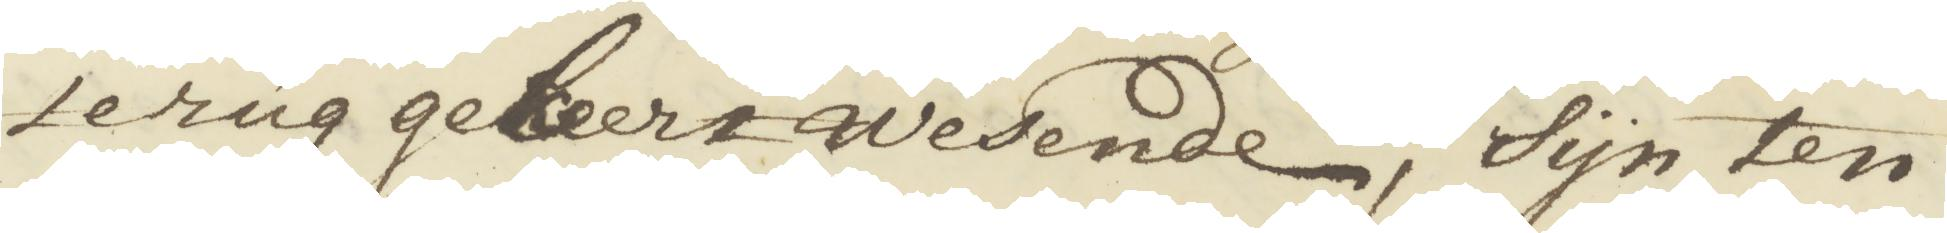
terug gekeert wesende, Sijn ten
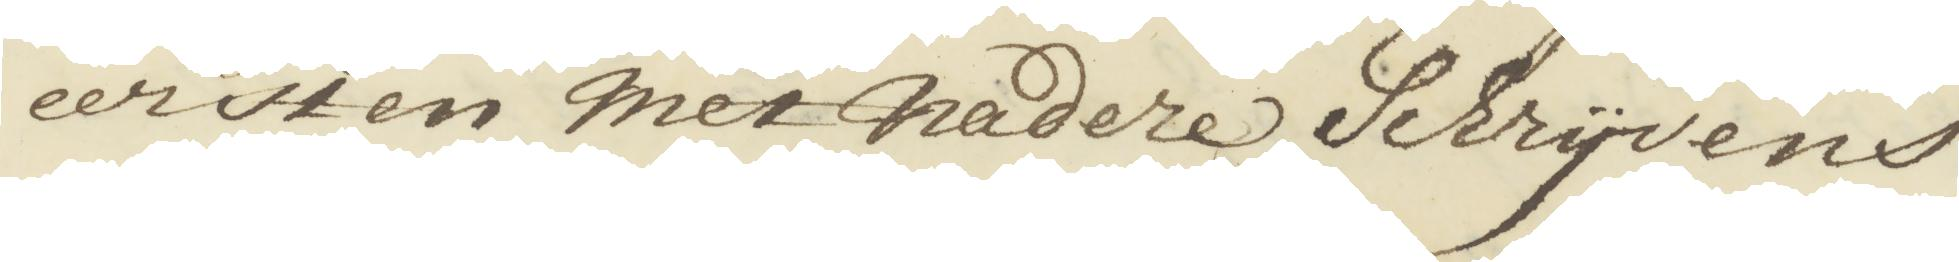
eersten met nadere Schrijvens
